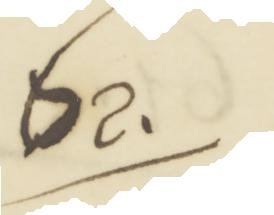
62.
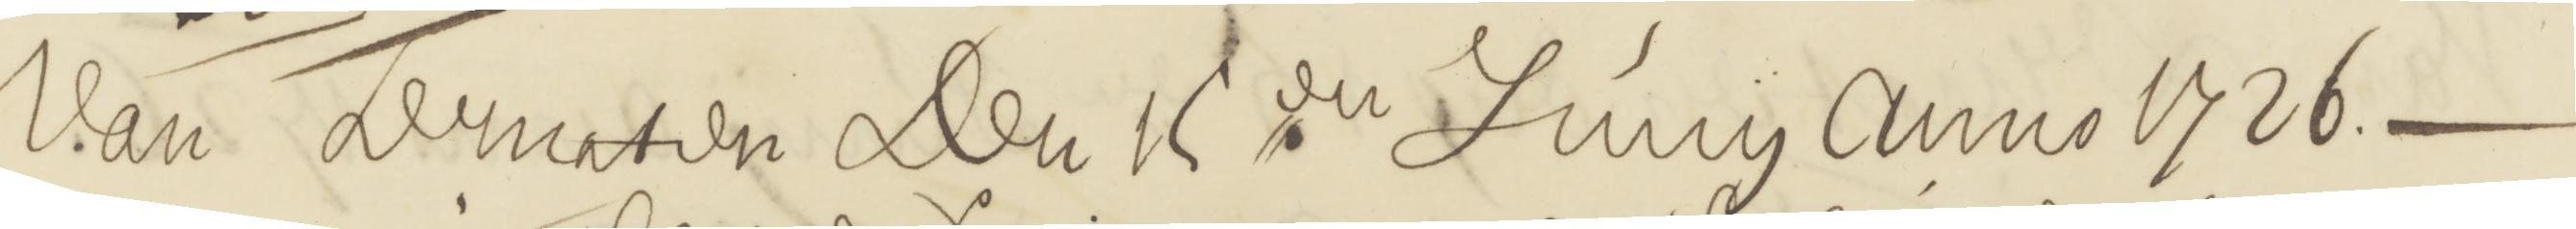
Van Ternaten Den 15„en Iunij Anno 1726.-
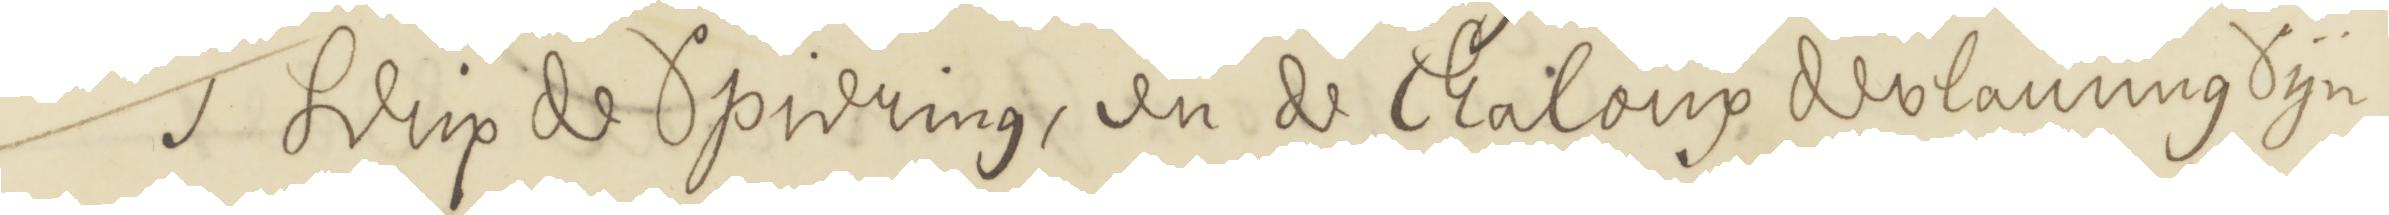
'T Schip de spiering, en de Chaloup de vlaming Sijn
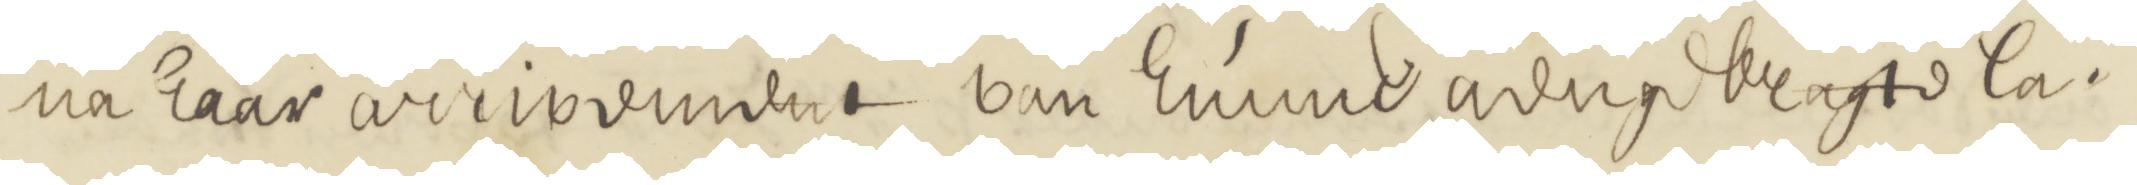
na haar arrivement van hunne aengebragte la„
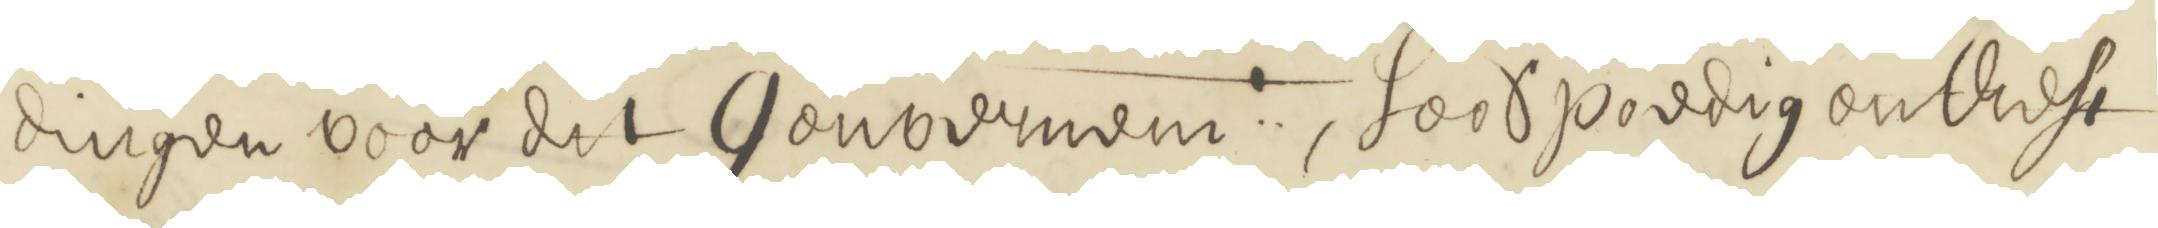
dingen voor dit Gouvernem:t, Soo spoedig ontheft
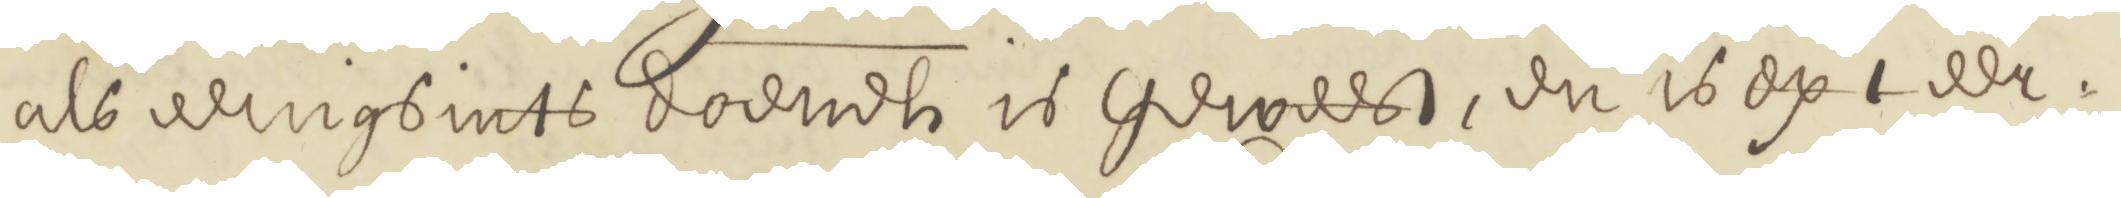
als eenigsints doenelijk is geweest, en is op 't eer„
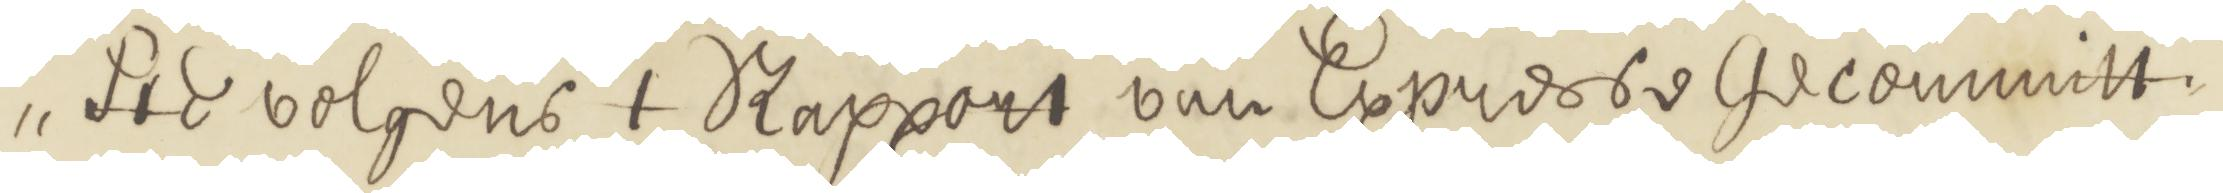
„ste volgens 't Rapport van Expresse gecommitt„s
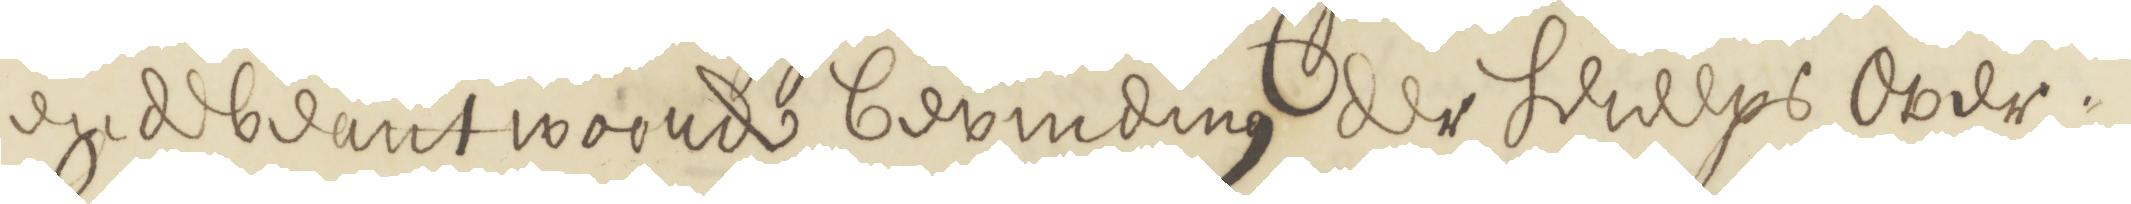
en de beantwoorde bevinding der Scheeps Over„
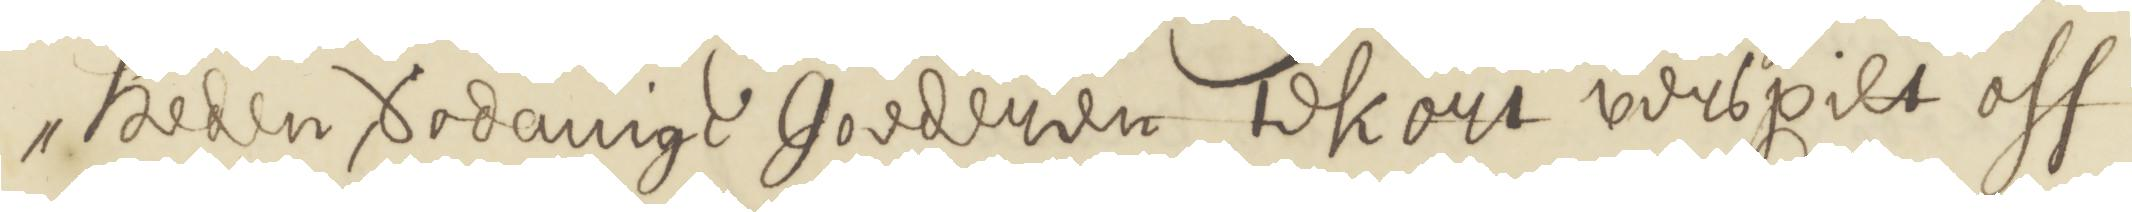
„heden Sodanige Goederen te kort verspilt off
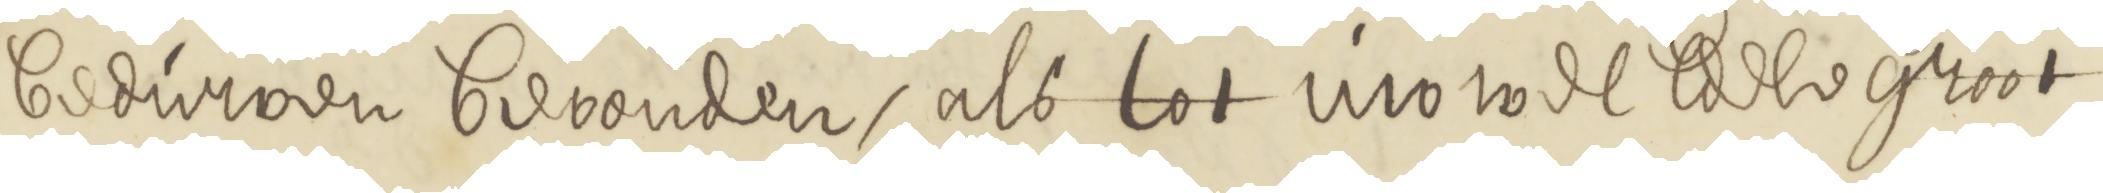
bedurven bevonden, als tot uw wel Edele groot
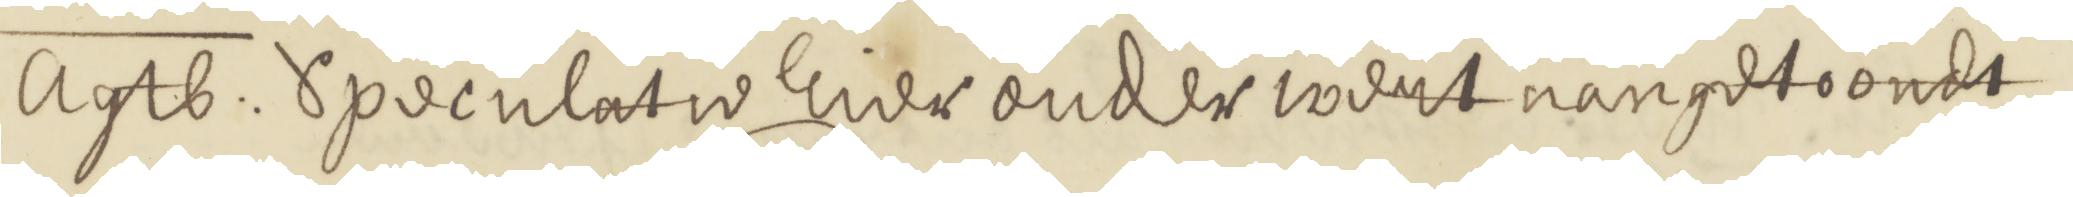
Agtb: Speculatie hier onder wert aangetoondt.
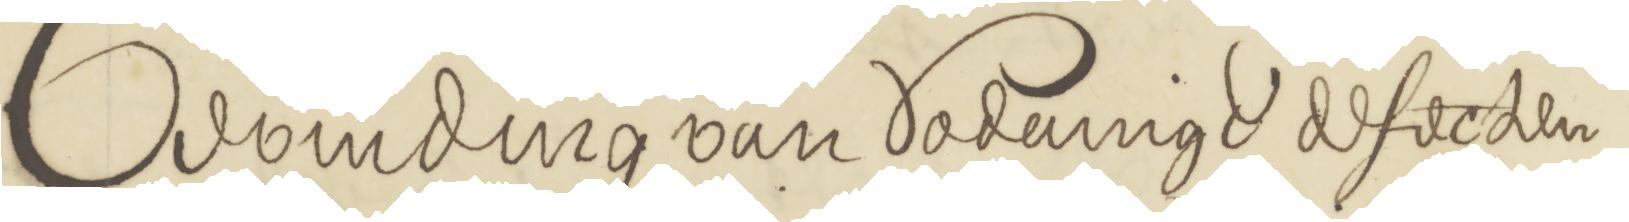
Bevinding van Sodanige defecten
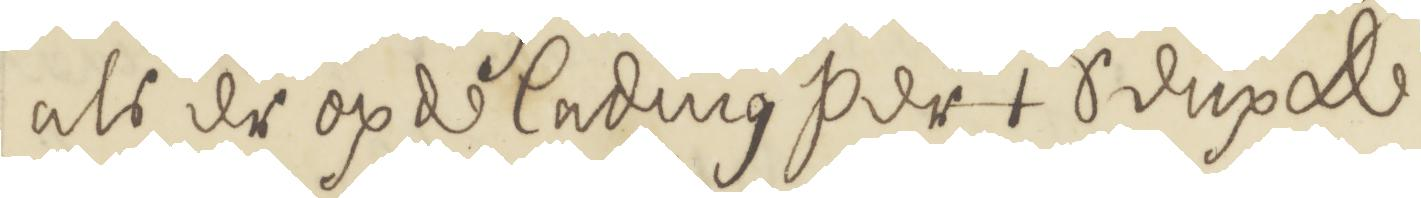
als 'er op de lading per 't Schip De
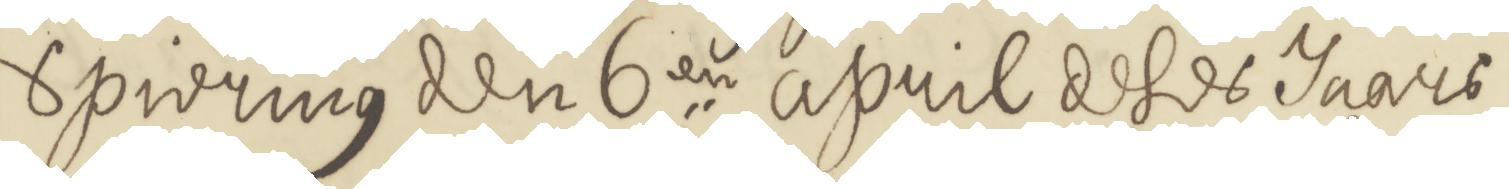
Spiering den 6„en april deses Iaars
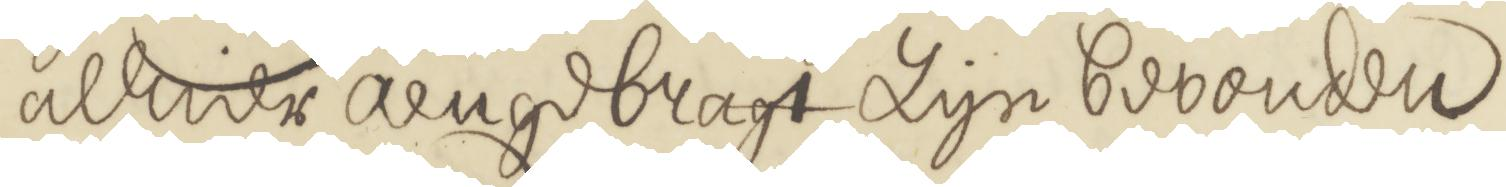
alhier aengebragt Zijn bevonden
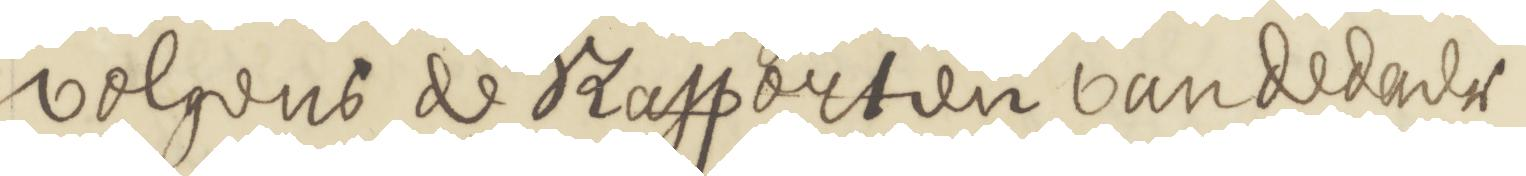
volgens de Rapporten van de daer
